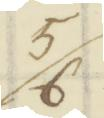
5/6
